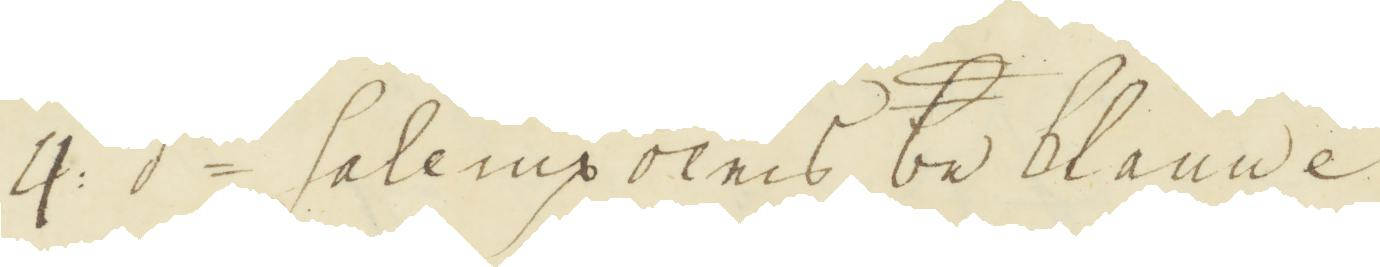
4: d=m salempoeris br blauwe
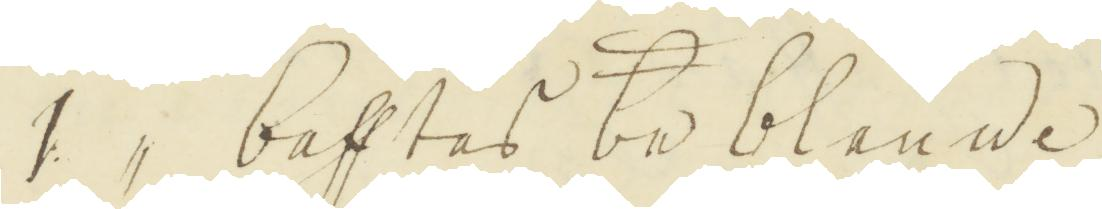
1: „ bafftas br blauwe
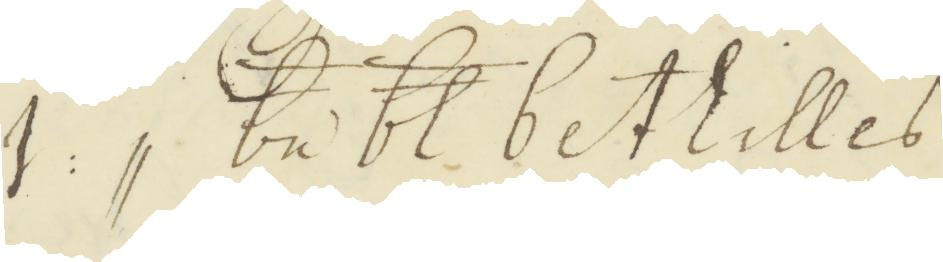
1: „ br bl bethilles
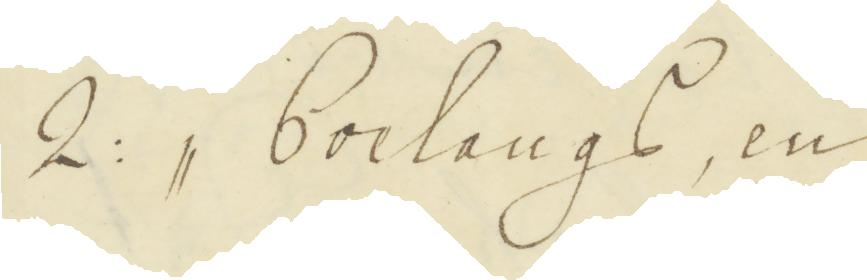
2: „ boelangs, en
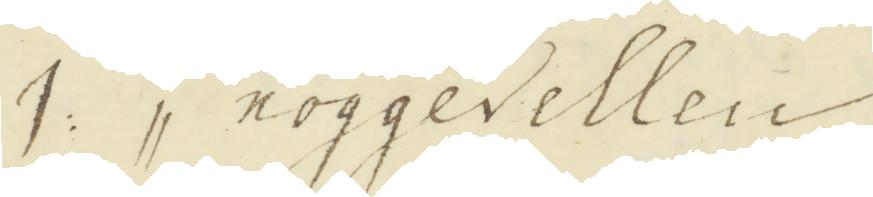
1: „ roggevellen
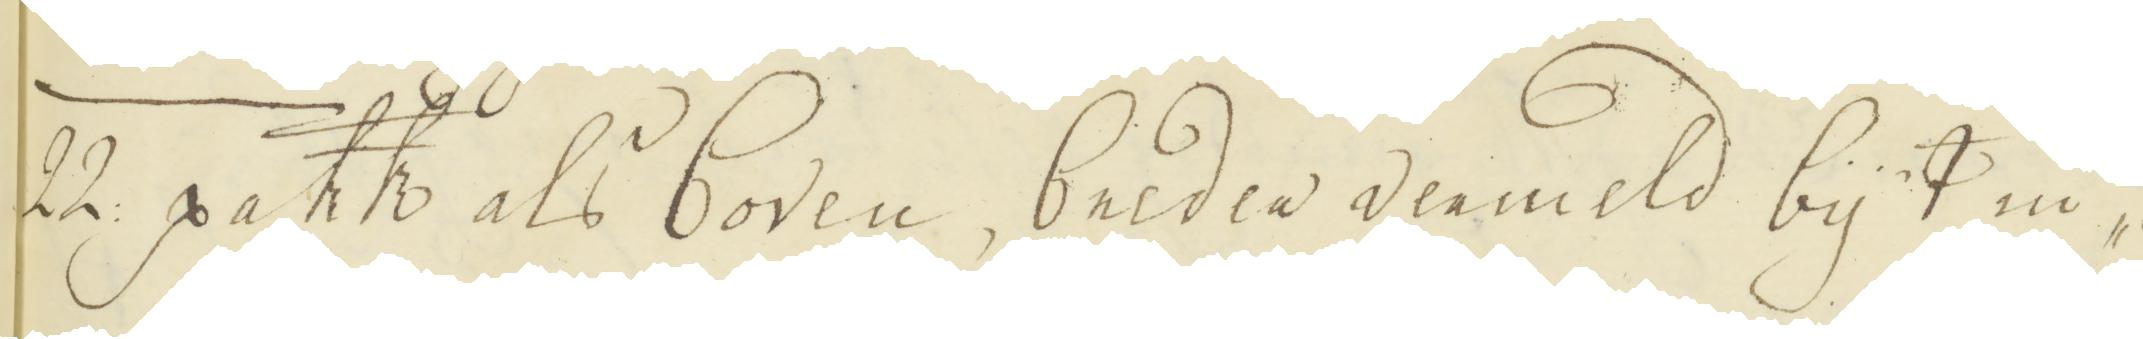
22: pakk als boven, breder vermeld bij 't in„
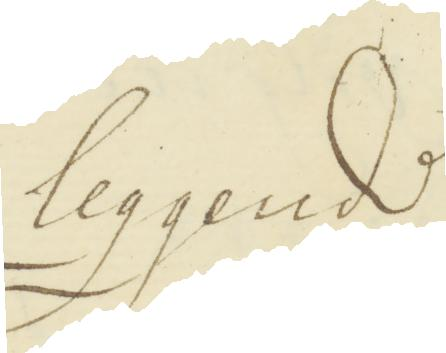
leggende
